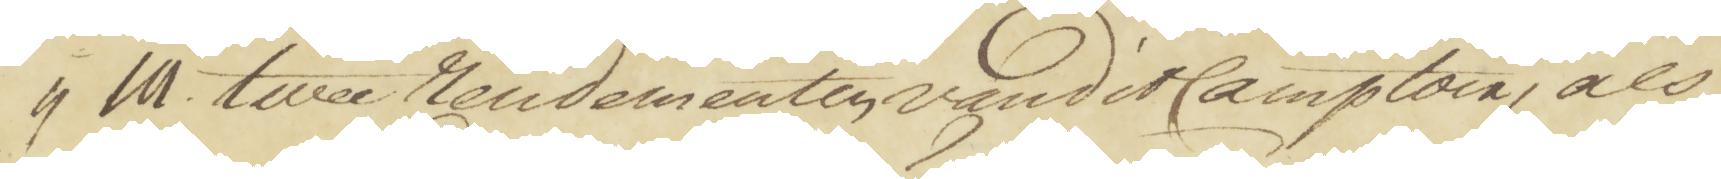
„ 14. twee rendementen van dit Comptoir, als
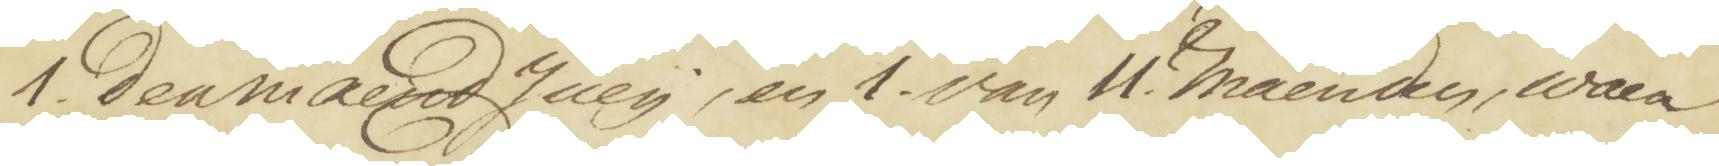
1. der maend Julij, en 1. van 11. maenden, waer
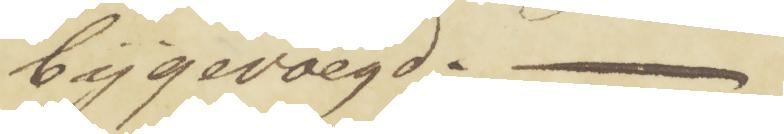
bij gevoegd. —
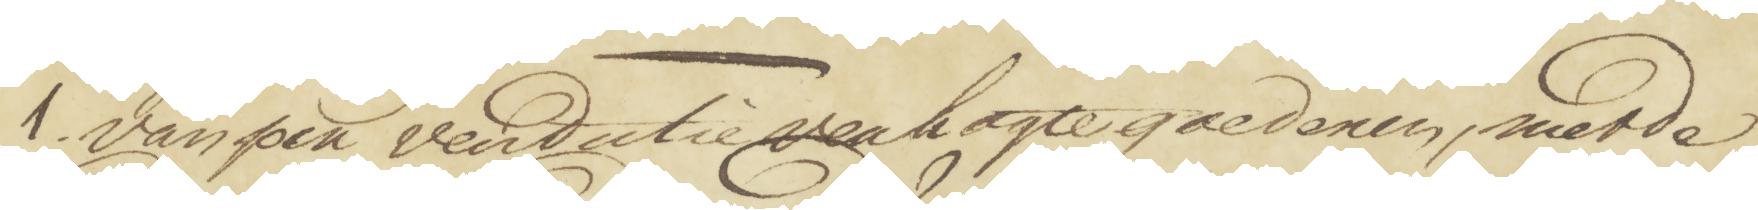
1. van per vendutie verkogte goederen, met de
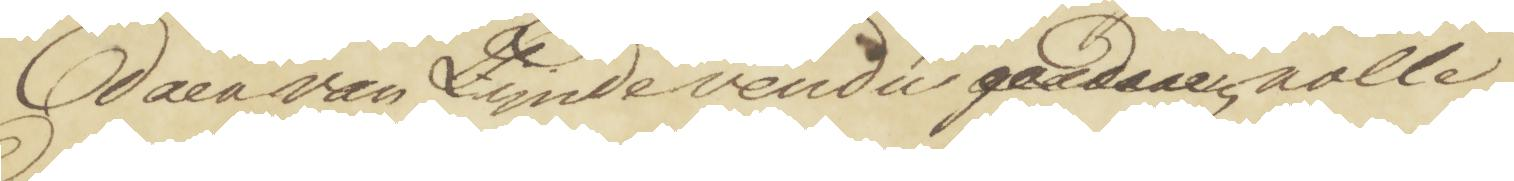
daervan zijnde vendu goederen rolle
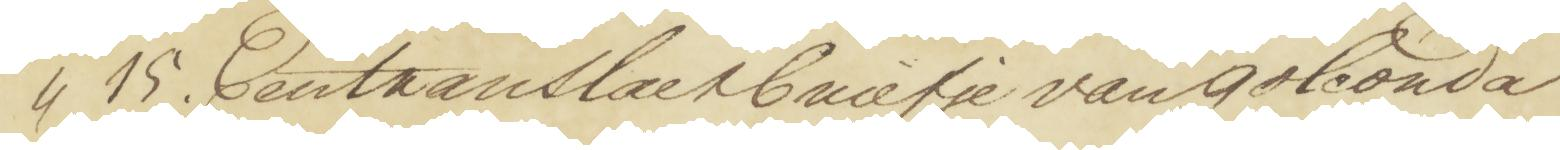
„ 15. Een translaet briefje van golcorda
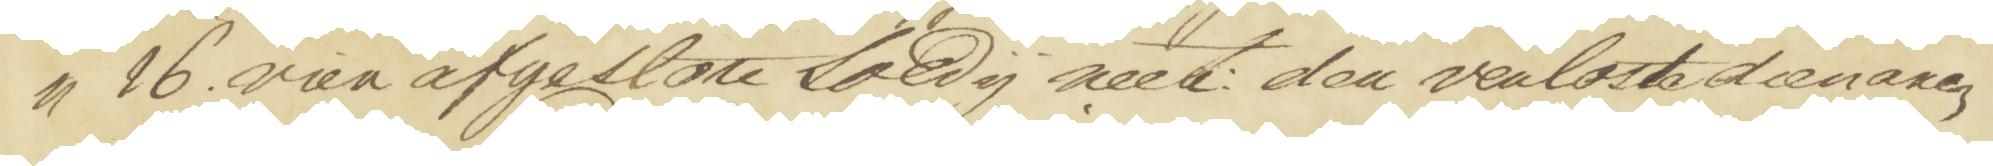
„ 16. vier afgeslote soldij reek: der verloste dienaren
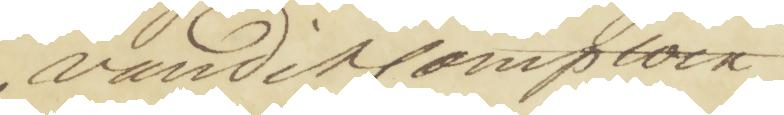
van dit Comptoir
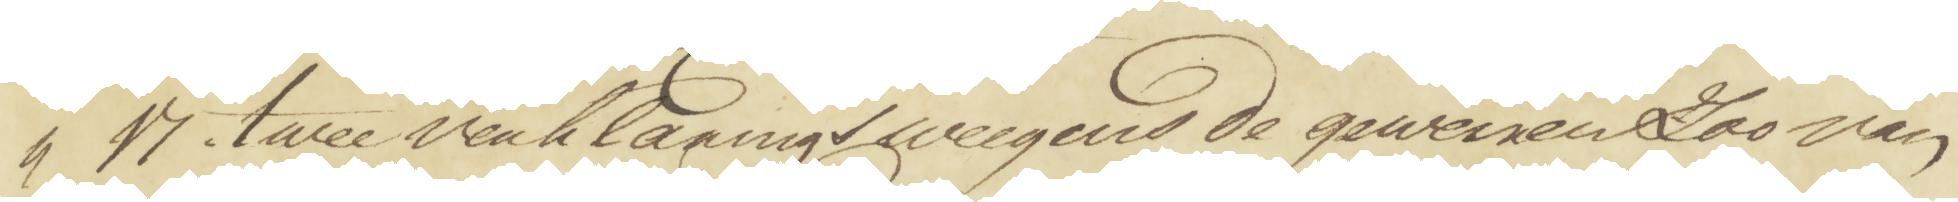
„ 17. twee verklarings weegens de geweiren zoo van
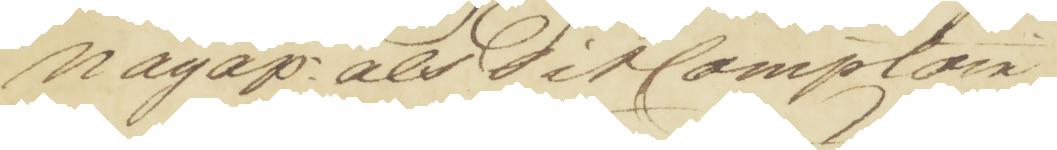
nagap: als dit Comptoir
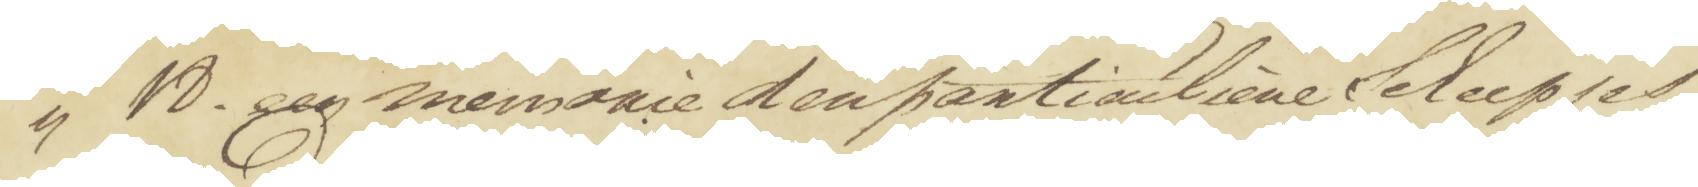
„ 18. een memorie der particuliere scheepjes
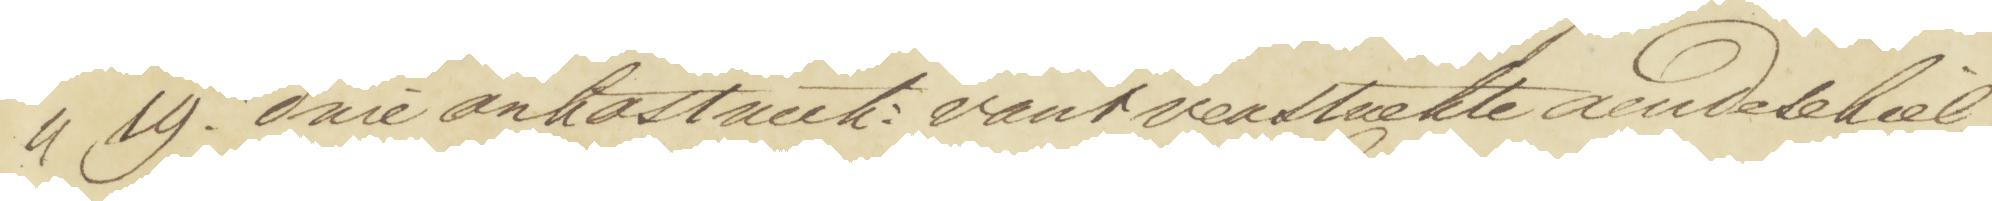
„ 19. drie onkostreek: van't verstrekte aen dese kiel
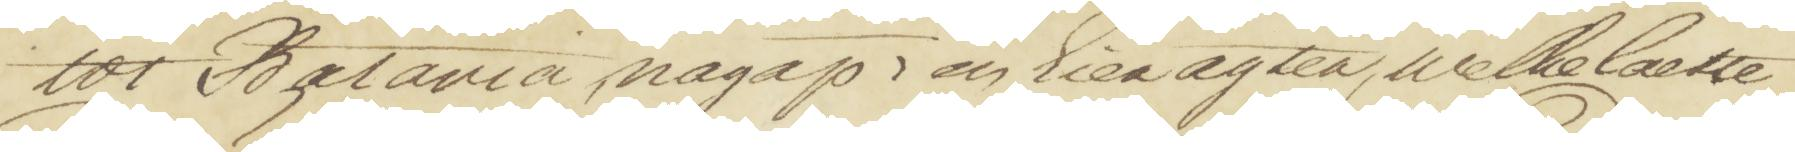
tot Batavia, nagap: en hier agter, welke laeste
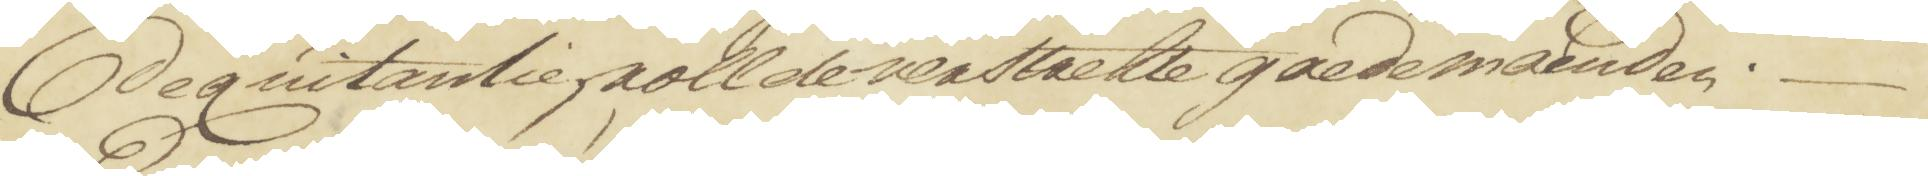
de quitantien roll de verstrekte goede maenden. —
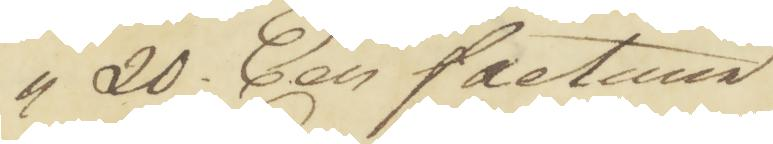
„ 20. Een factuur
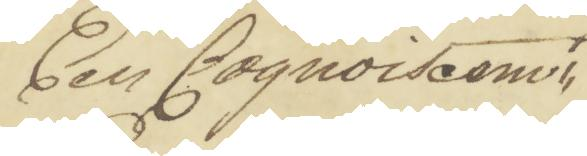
Een Cognoiscem„t
